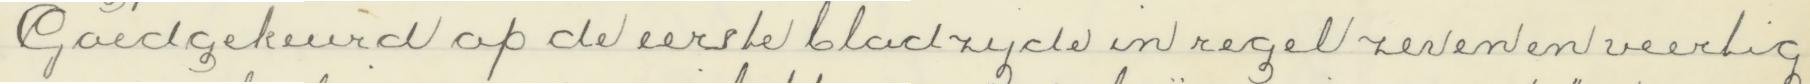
Goedgekeurd op de eerste bladzyde in regel zeven en veertig
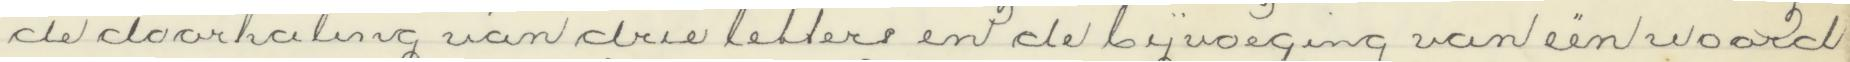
de doorhaling van drie letters en de bijvoeging van één woord
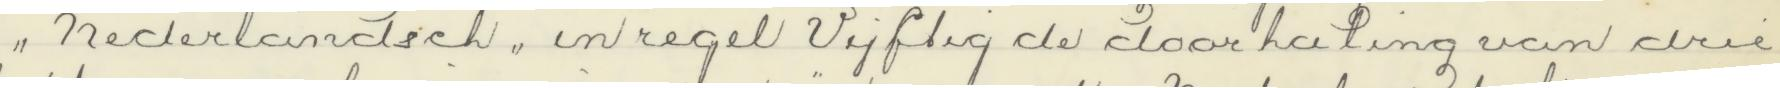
„ Nederlandsch „ in regel Vijftig de doorhaling van drie
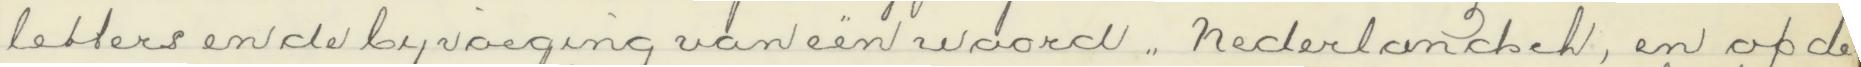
letters en de byvoeging van één woord „ nederlandsch, en op de
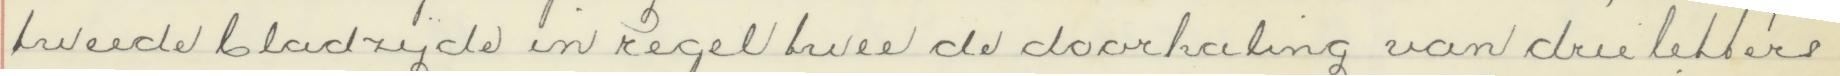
tweede bladzyde in regel twee de doorhaling van drie letters
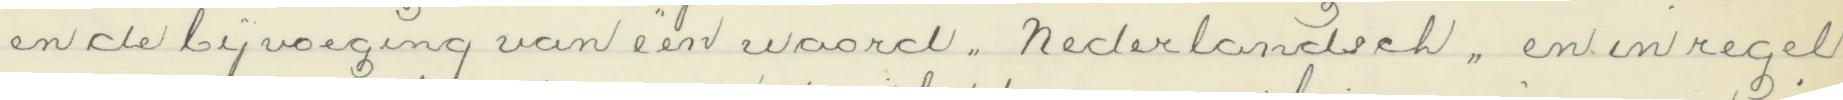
en de bijvoeging van één woord „ Nederlandsch „ en in regel
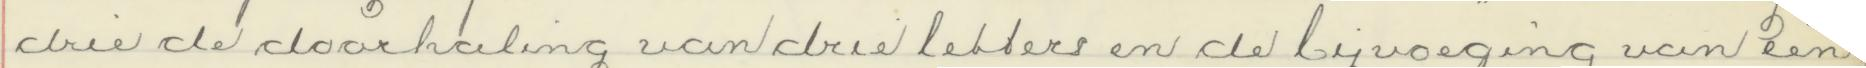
drie de doorhaling van drie letters en de bijvoeging van één
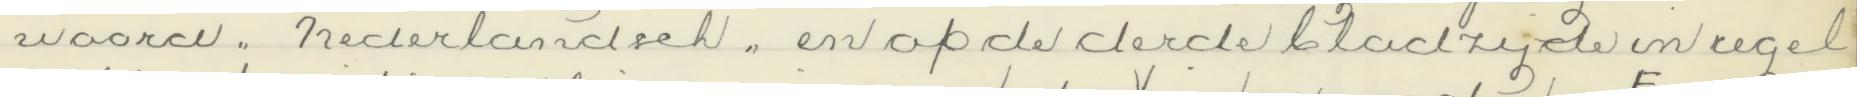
woord „ Nederlandsch „ en op de derde blaatzijde in regel
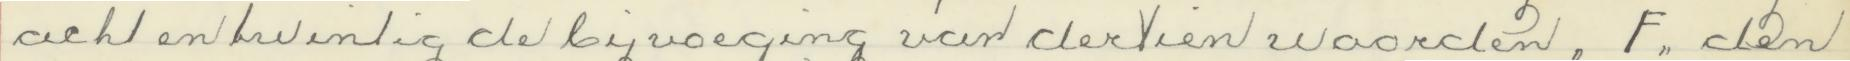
acht en twintig de bijvoeging van dertien waarden „ ¶ „ den
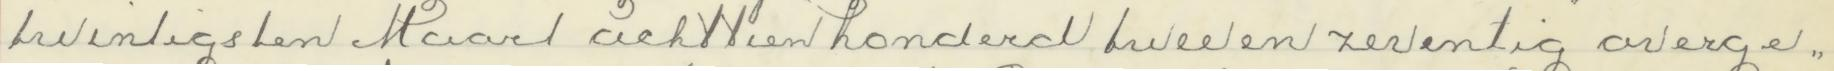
twintigsten Maart achttien honderd twee en zeventig overge„
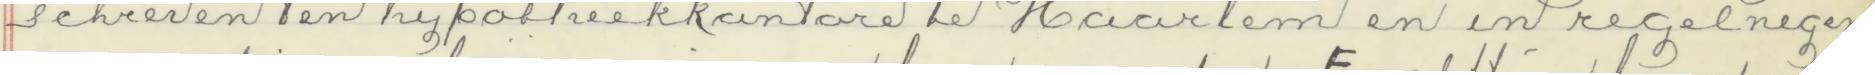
schreven ten hypotheekkantore te Haarlem en in regel negen
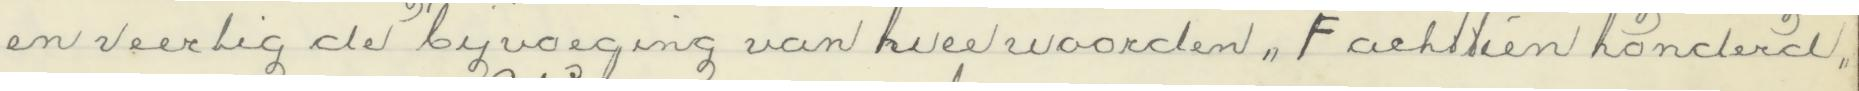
en veertig de byvoeging van twee woorden „ F achttien honderd „
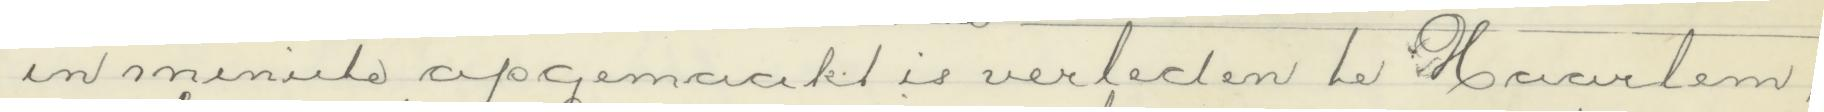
in minute opgemaakt is verleden te Haarlem
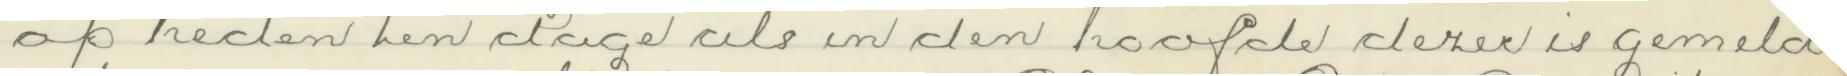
op heden ten dage als in den hoofde dezer is gemeld
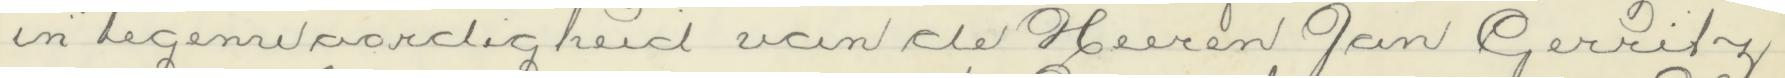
in tegenwoordigheid van de Heeren Jan Gerritz
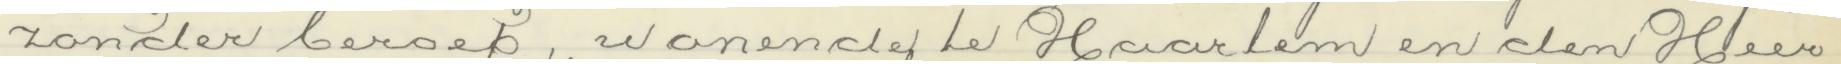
zonder beroep, wonende te Haarlem en den Heer
